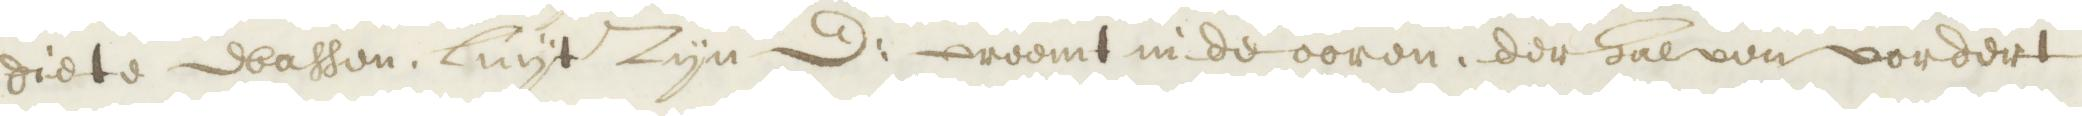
die te wassen, luijt zijn E: vreemt in de ooren, der halven vordert
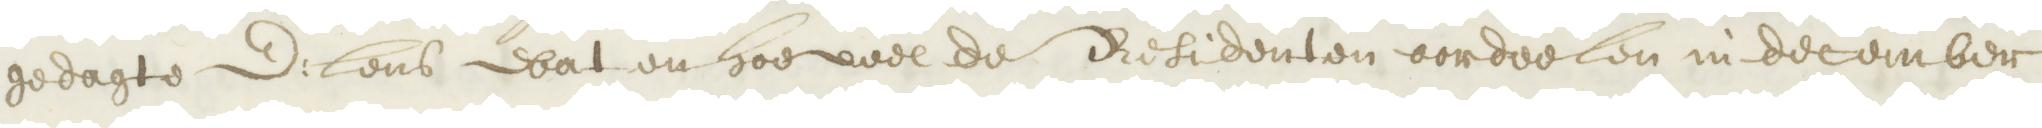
gedagte E:lens wat en hoeveel de Residenten oordeelen in december
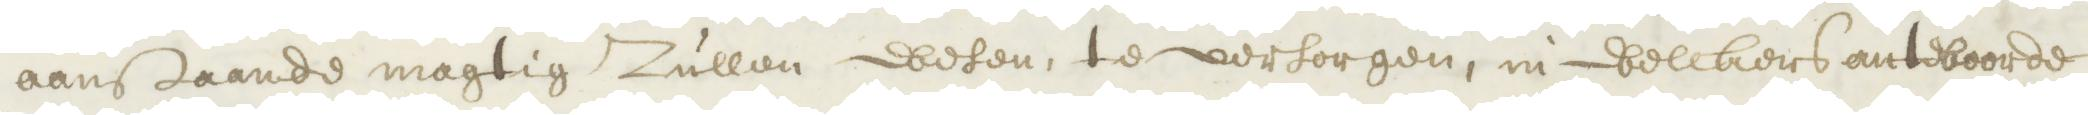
aanstaande magtig zullen wesen, te versorgen, in welckers antwoorde
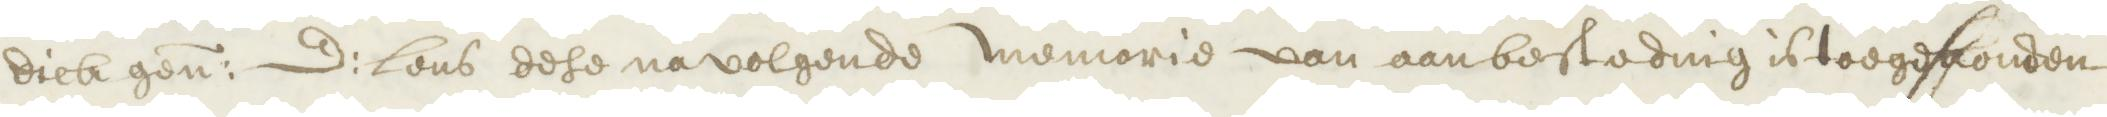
dick gen: E:lens dese navolgende memorie van aanbesteding is toegesonden
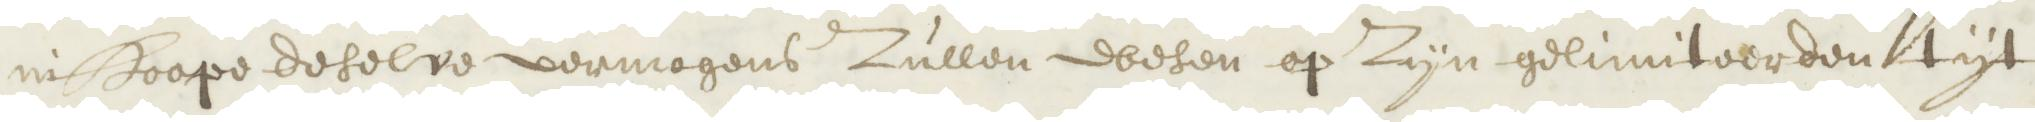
in hoope deselve vermogens zullen wesen op zijn gelimiteerden tijt
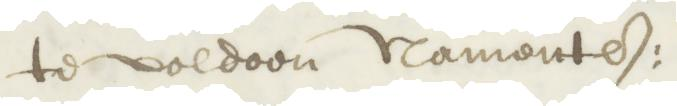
te voldoen Namentlijk
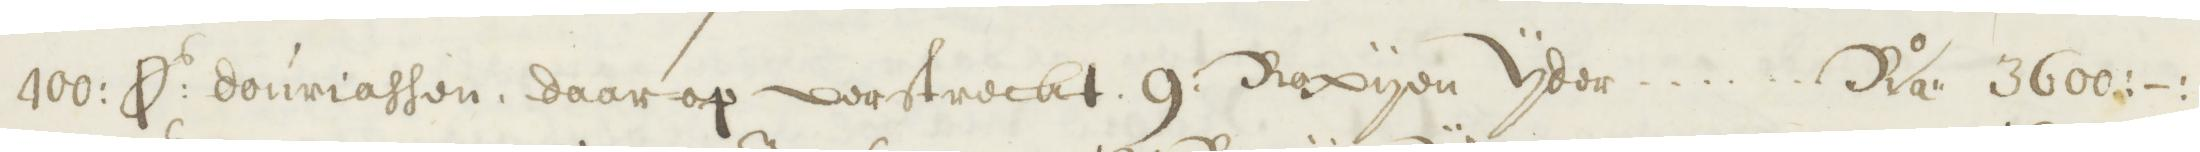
400: p:s douriassen, daar op verstreckt 9: Rapijen ijder - - - - - - - R o/a„ 3600: —:
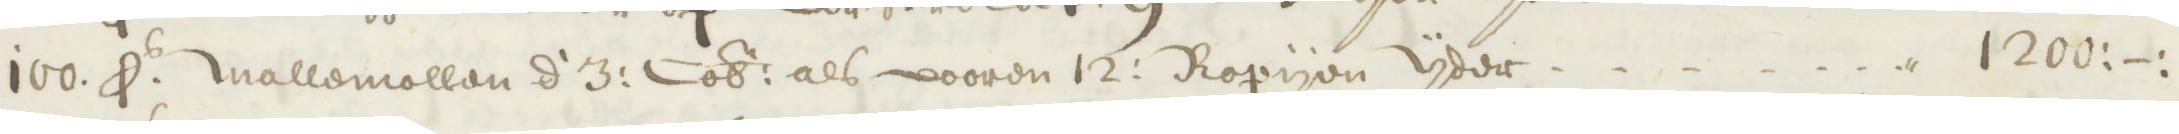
100. p.s mallemollen d’ 3: cob:' als vooren 12: Ropijen ijder - - - - - - - „ 1200: —:
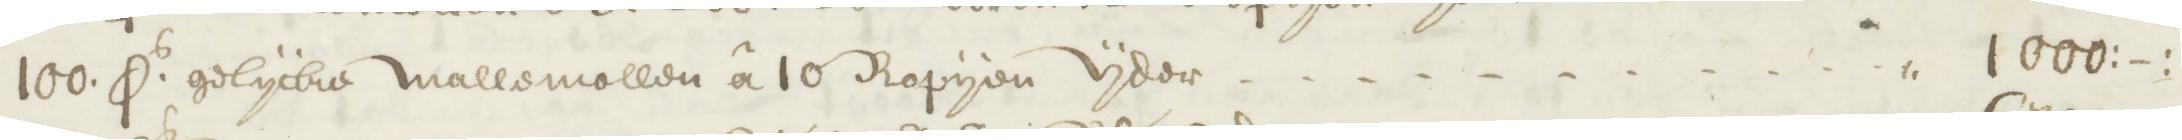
100. p.s gelijcke mallemollen â 10 Ropijen ijder - - - - - - - - - - - „ 1000: —:
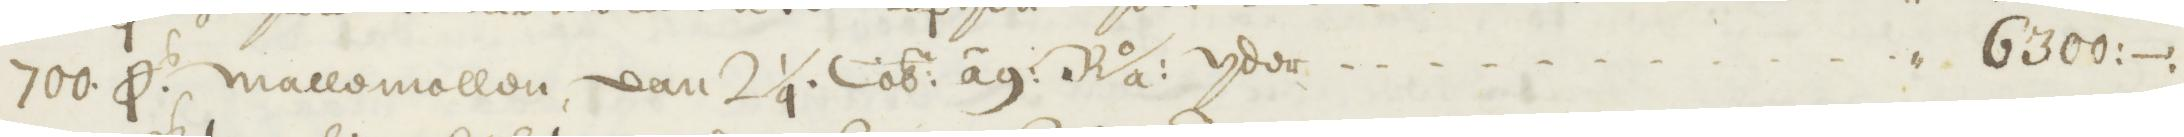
700. p.s mallemollen, van 2¼. cob:' ag: R/a: o yder - - - - - - - - - - - „ 6300: —:
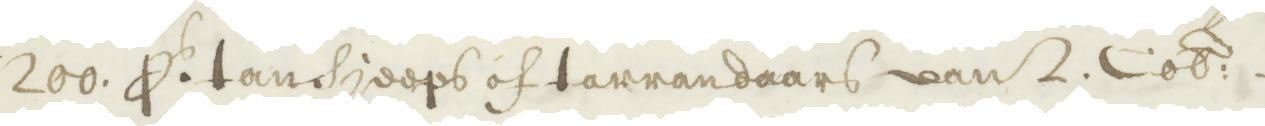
200. p.s tansjeeps of tarrandaars van 2. cob:
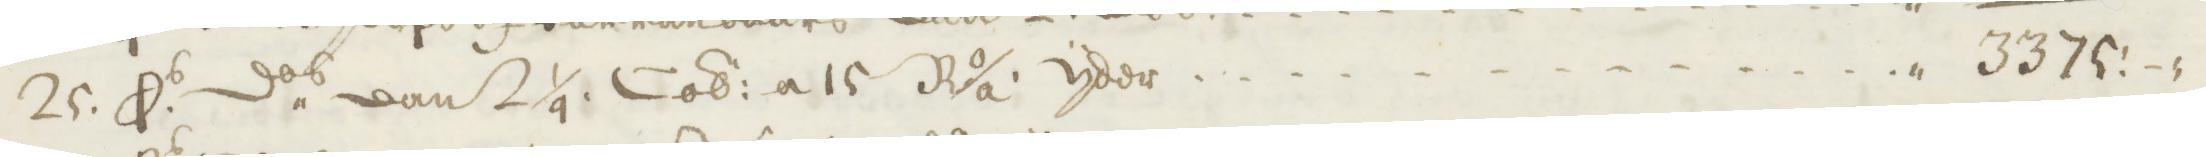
25. p.s D„os van 2¼. cob:' a 15 R/a. o ijder - - - - - - - - - - - - - „ 3575: —„
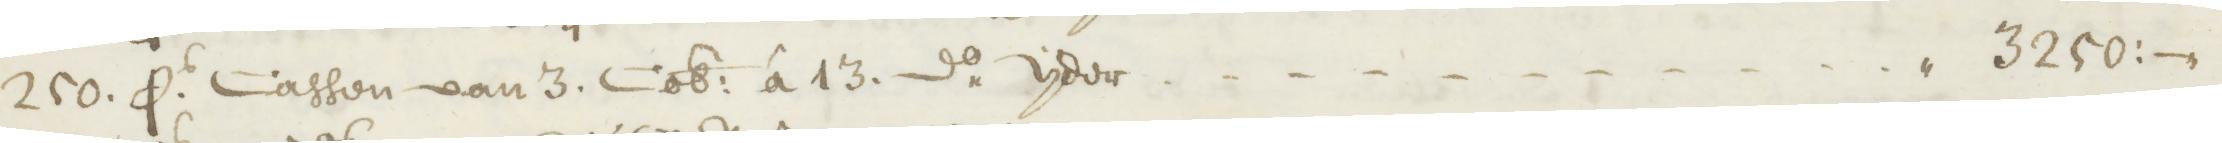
250. p.s cassen van 3. cob:' â 13. d„o ijder - - - - - - - - - - „ 3250: —„
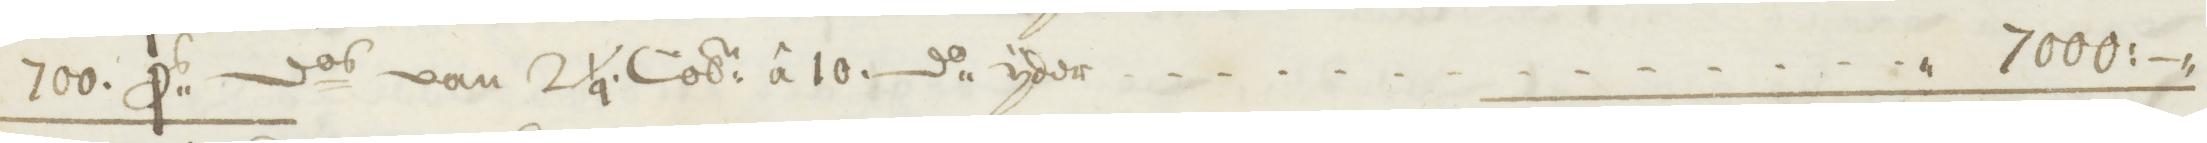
700. p„s d=os van 2¼. cob:' â 10. d„o ijder - - - - - - - - - - - - - - „ 7000: —„
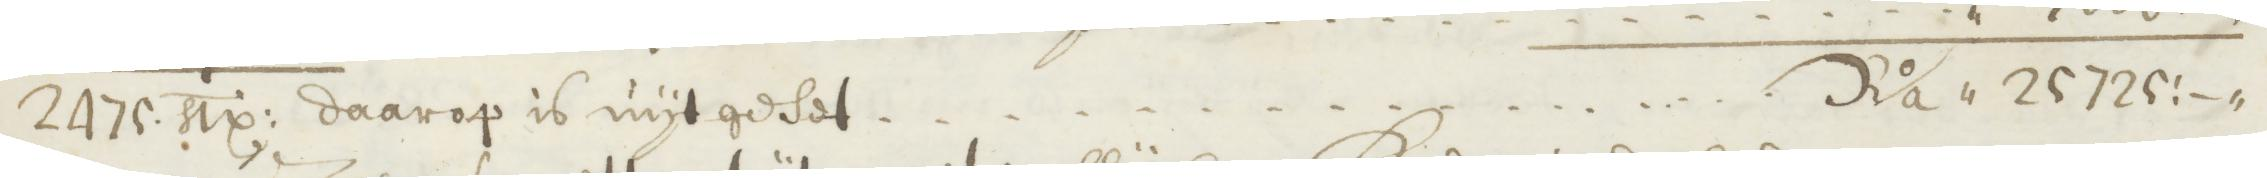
2475. stx: daarop is uijt geset - - - - - - - - - - - - - - - - - - R/a o „ 25725: —„
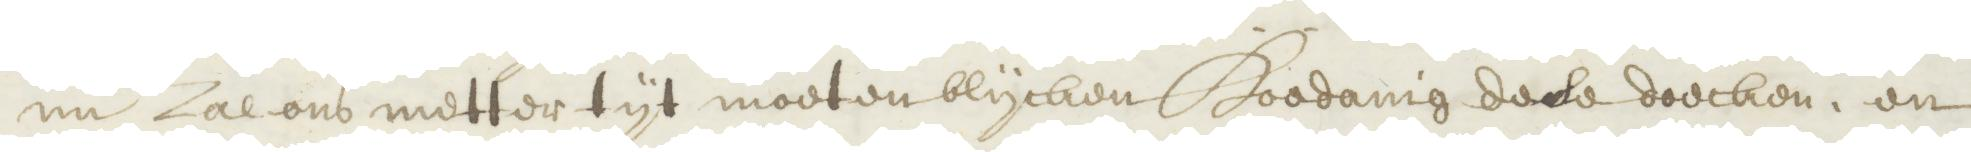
nu zal ons metter tijt moeten blijcken Hoedanig dese doecken, en
